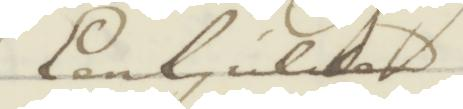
EenGulden
